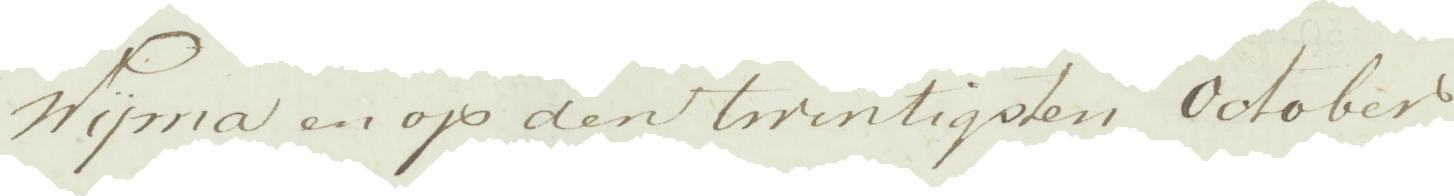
Wijma en op den twintigsten October
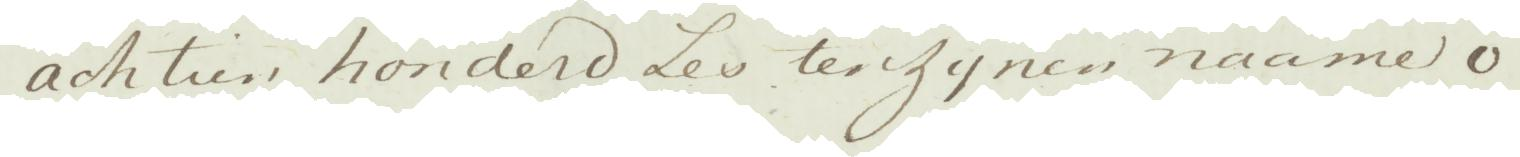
achtien honderd zes ten zijnen naame o
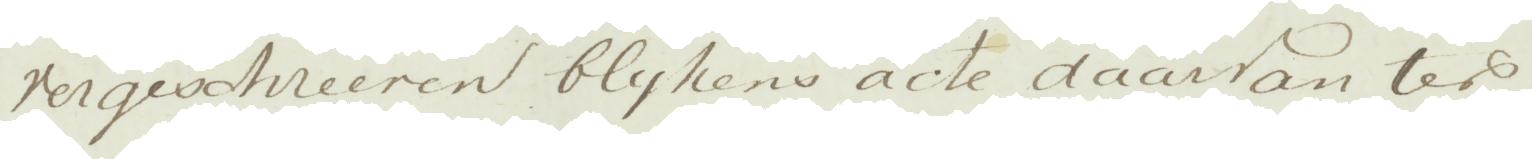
vergeschreeven blijkens acte daarvan ter
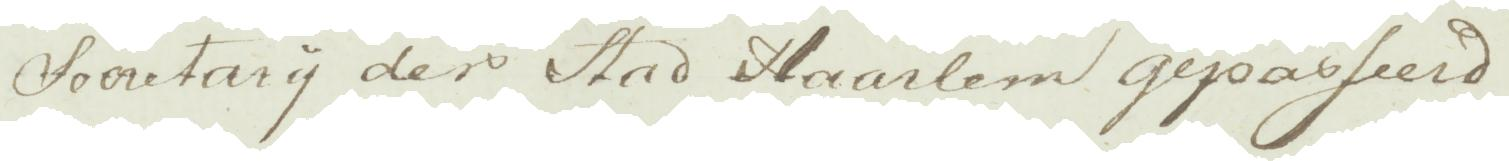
Secretarij der Stad Haarlem gepasseerd
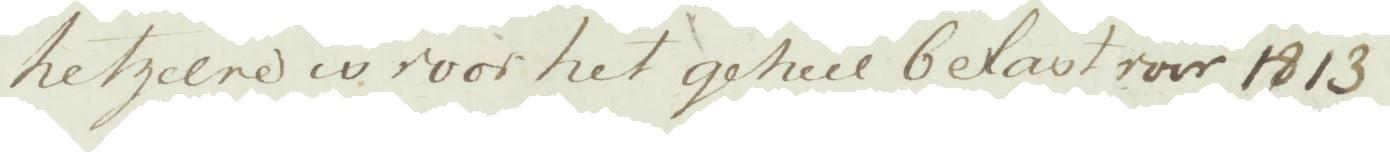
hetzelve is voor het geheel belast voor 1813
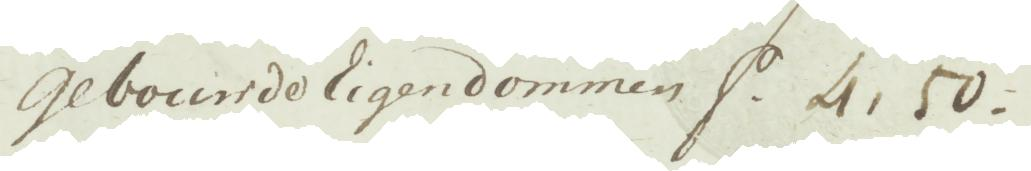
gebouwde Eigendommen ƒ. 4„ 50.
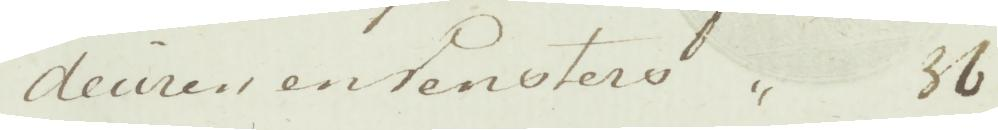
deuren en Vensters „ 36
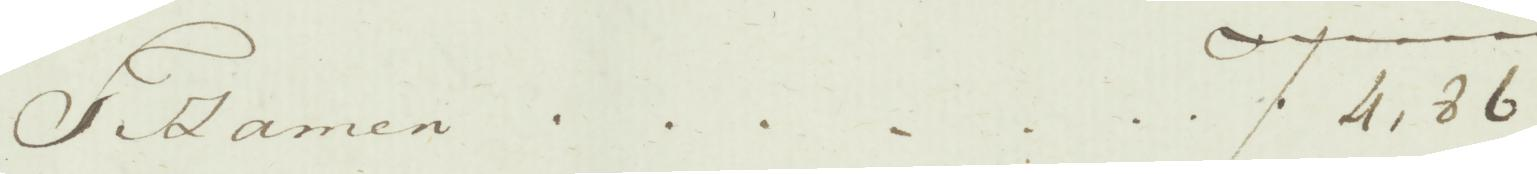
TeZamen . . . . . . . ƒ 4, 86
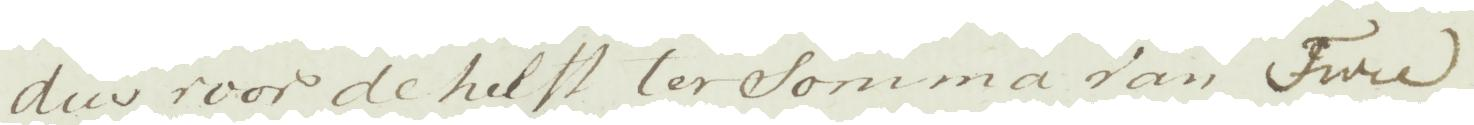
dus voor de helft ter somma van Twee
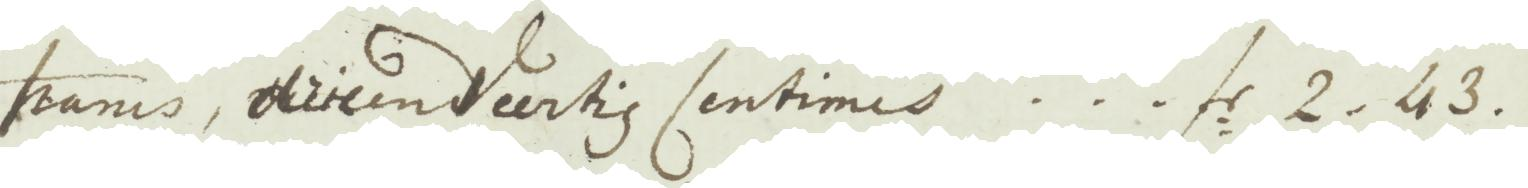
francs, drieen Veertig Centimes . . . f:r 2. 43.
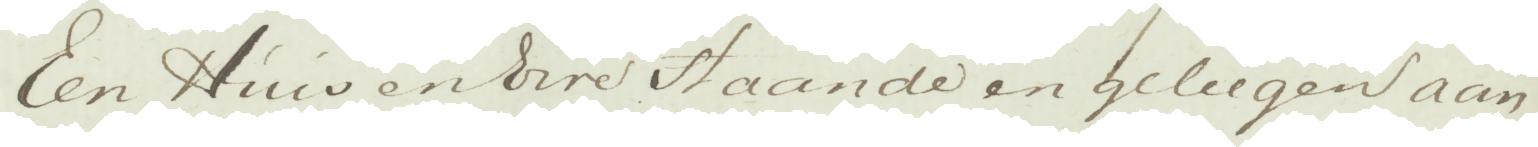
Een Huis en Erve staande en geleegen aan
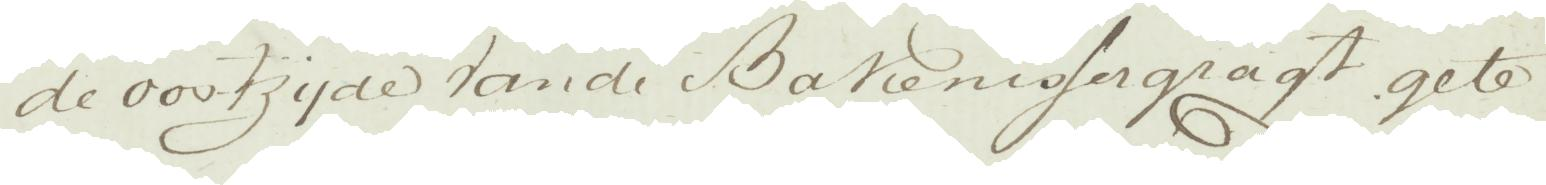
de oostzijde van de Bakenissergragt gete
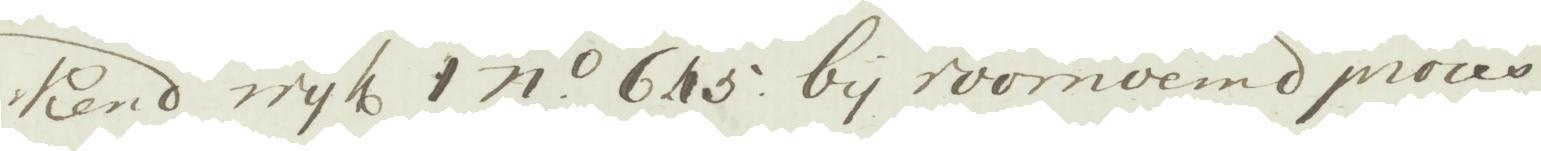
„kend wijk 1 n.o 645. bij voornoemd proces
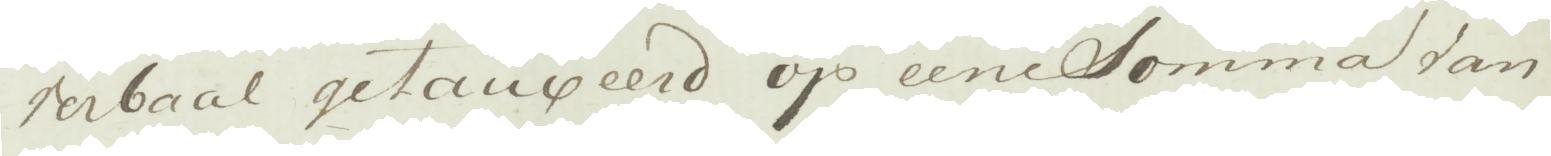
verbaal getauxeerd op eene somma van
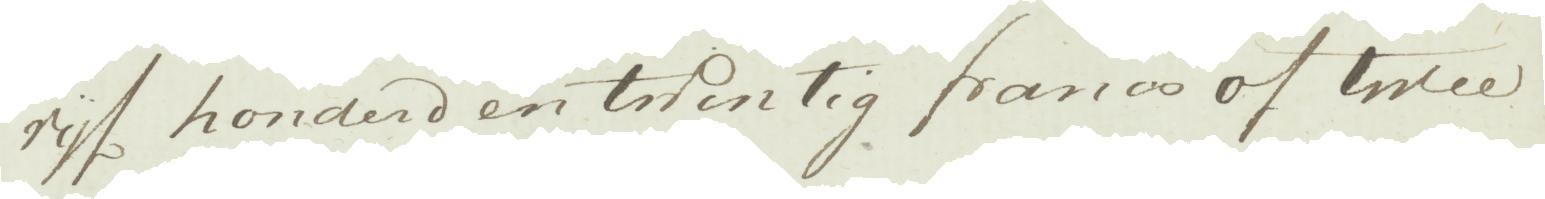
vijf honderd en twintig francs of twee
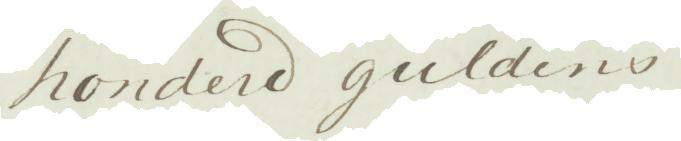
honderd guldens
